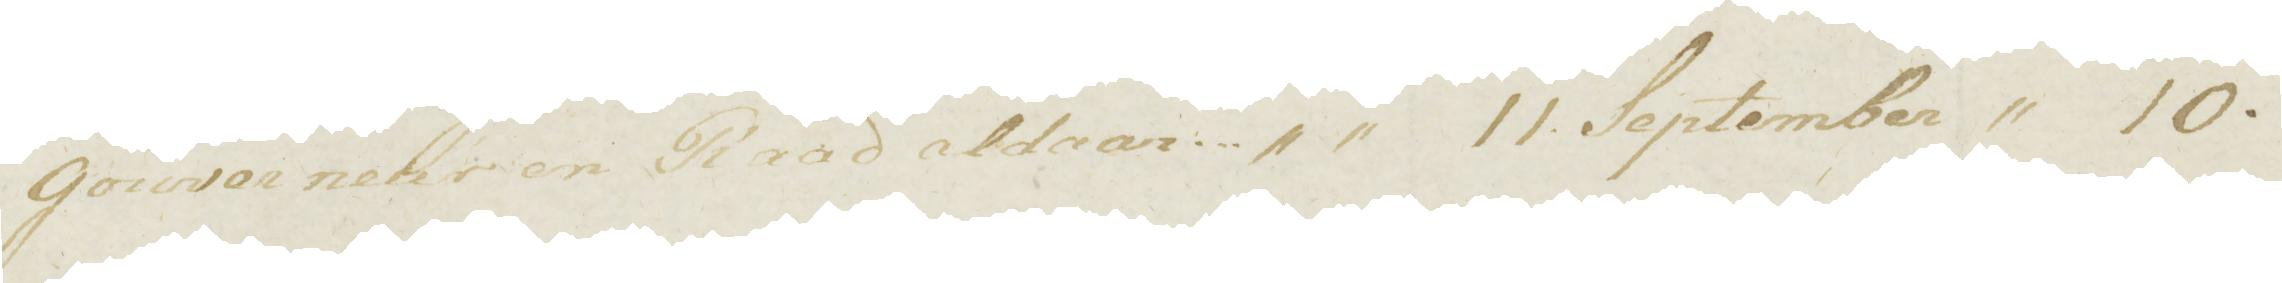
Gouverneur en Raad aldaar „ „ 11. September „ 10.
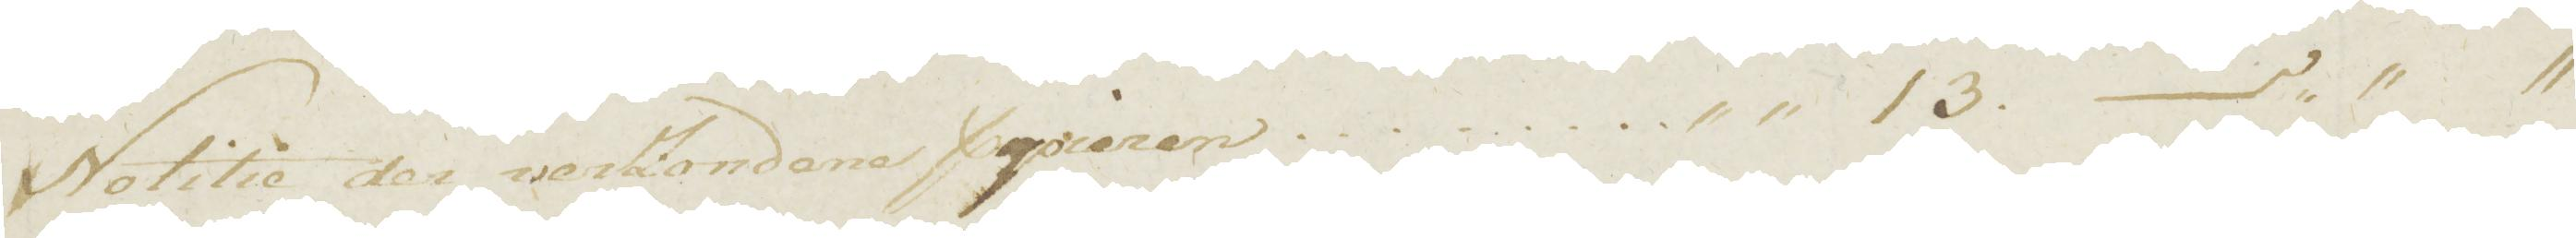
Notitie der verzondene papieren „ „ 13. — „ „ „
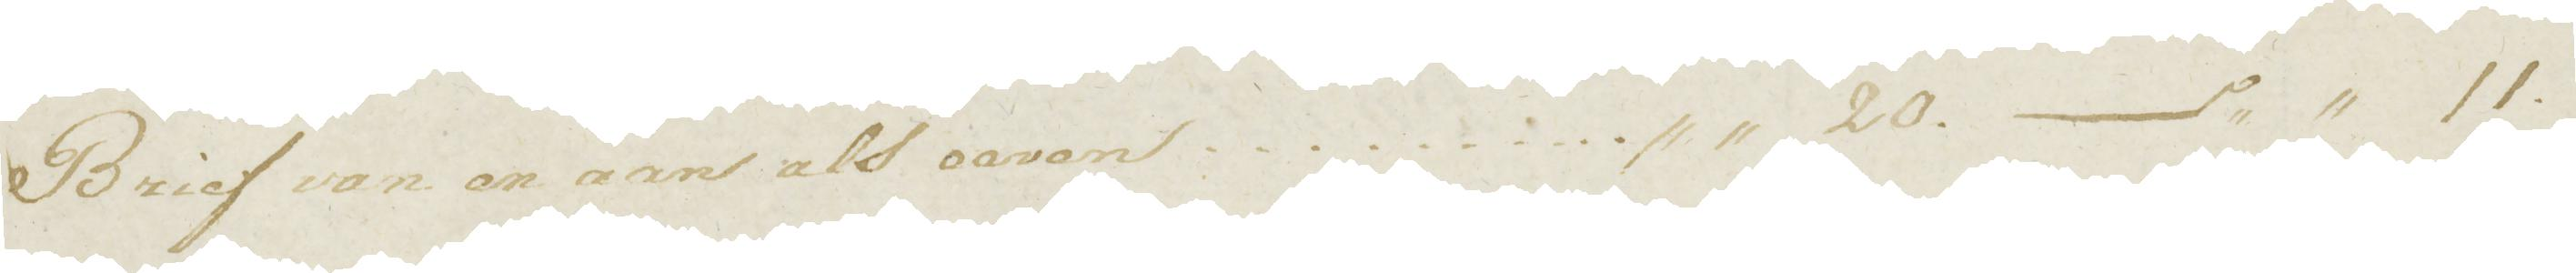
Brief van en aan als ooren „ „ 20. — „ „ 11.
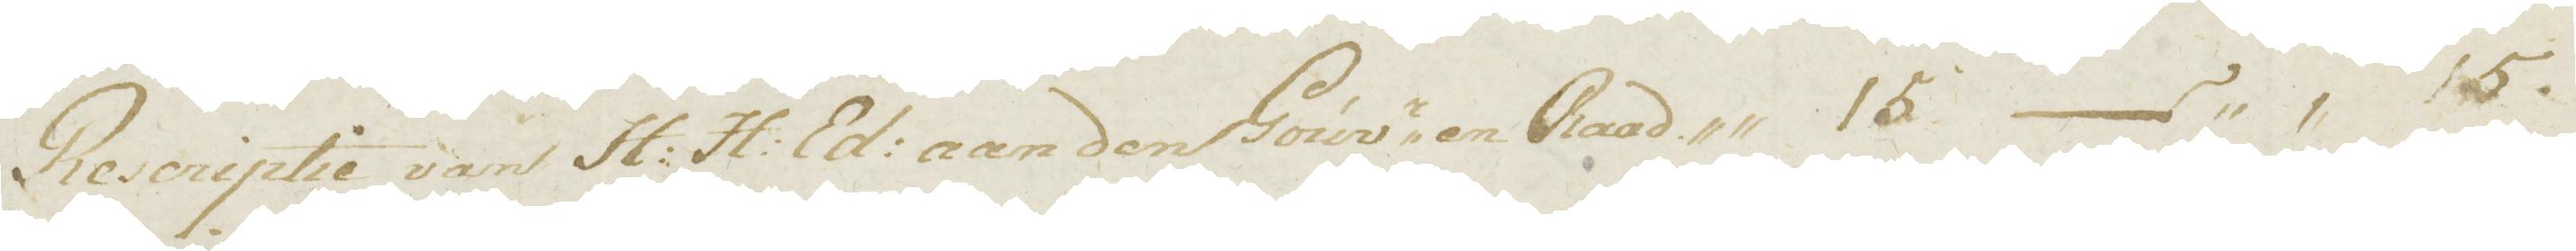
Prescriptie van H: H: Ed: aan den Gouv:r en Raad „ „ 15 — „ „ 15.
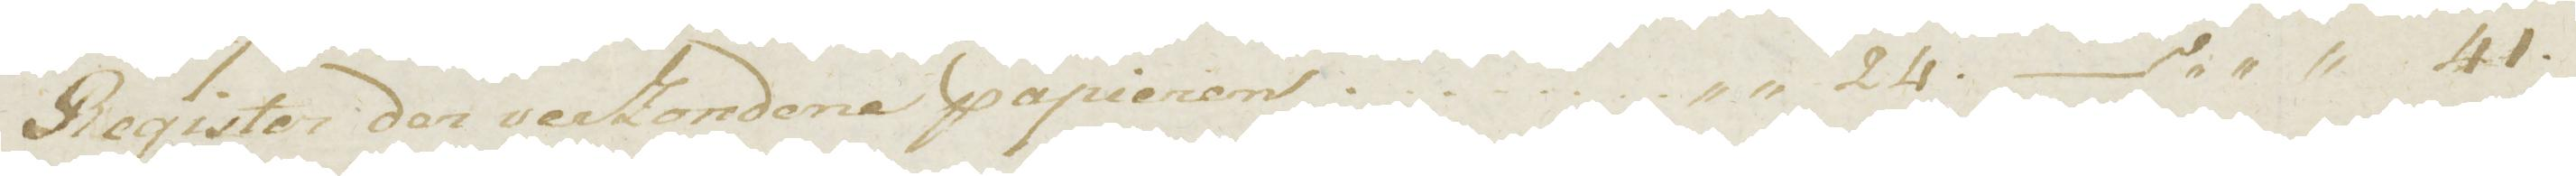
Register der verzondene papieren „ „ 24. — „ „ „ 41.
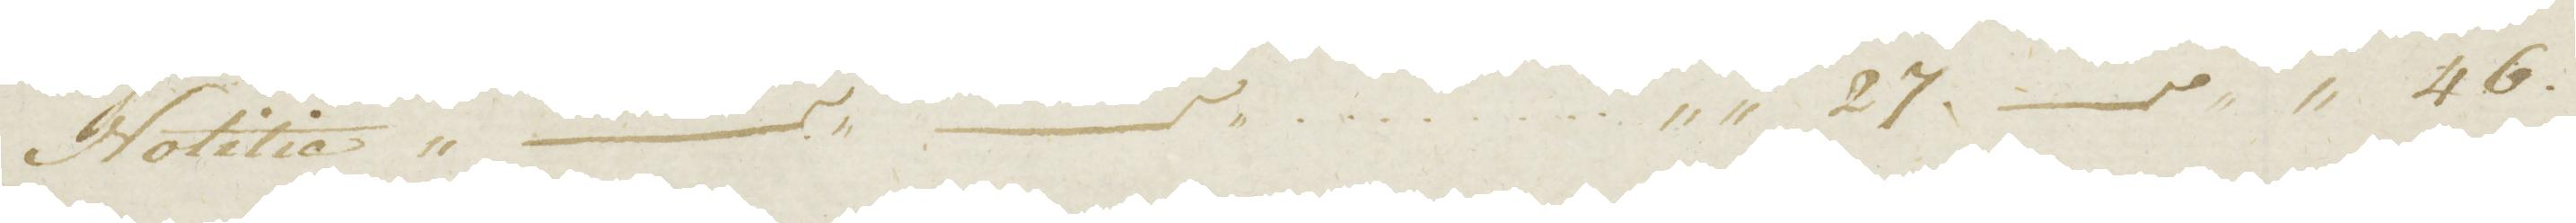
Notitie „ — „ — „ „ „ 27. — „ „ 46.
